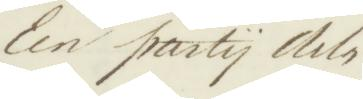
Een partij dito
